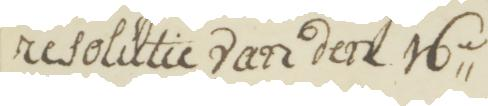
resolutie van den 16„e
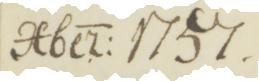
xber: 1757.
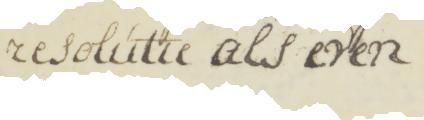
resolutie als even
